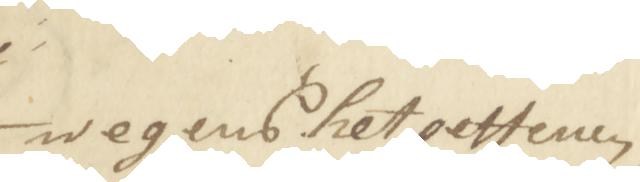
wegens het oeffenen
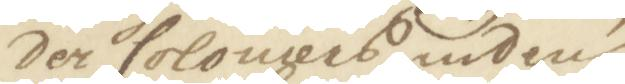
der Coloniers inden
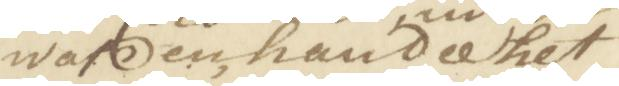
wapenhandel het
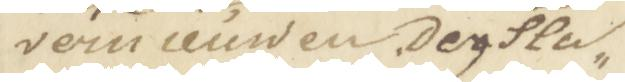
vernieuwen der sla„
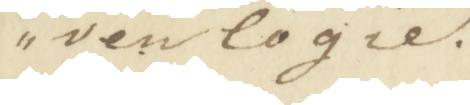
„ven logie
